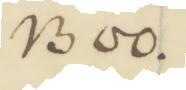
1300.
